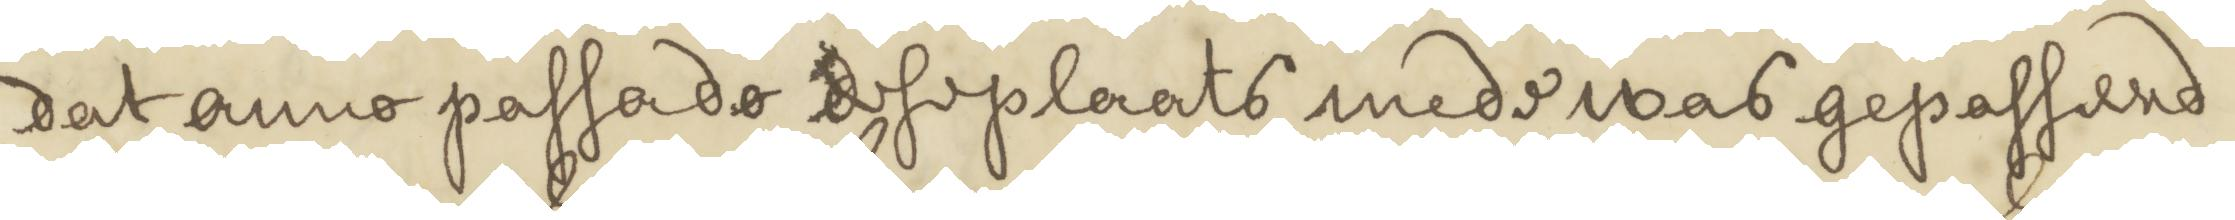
dat anno passado dese plaats mede was gepasseerd
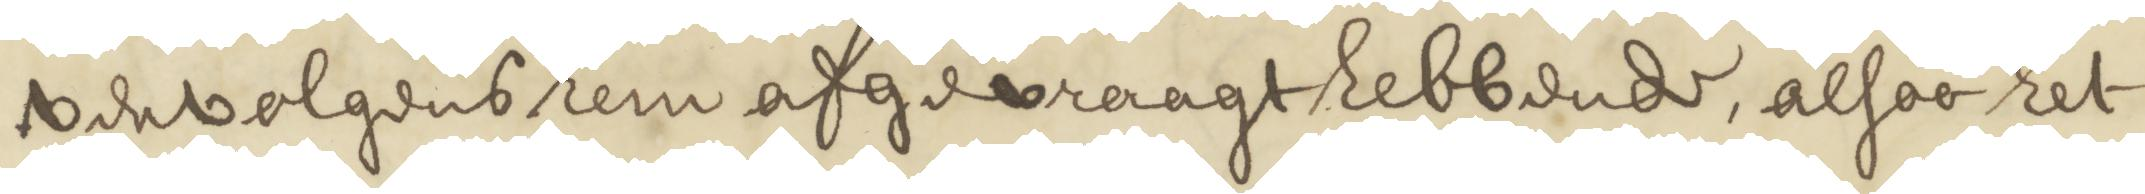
vervolgens hem afgevraagt hebbende, alsoo het
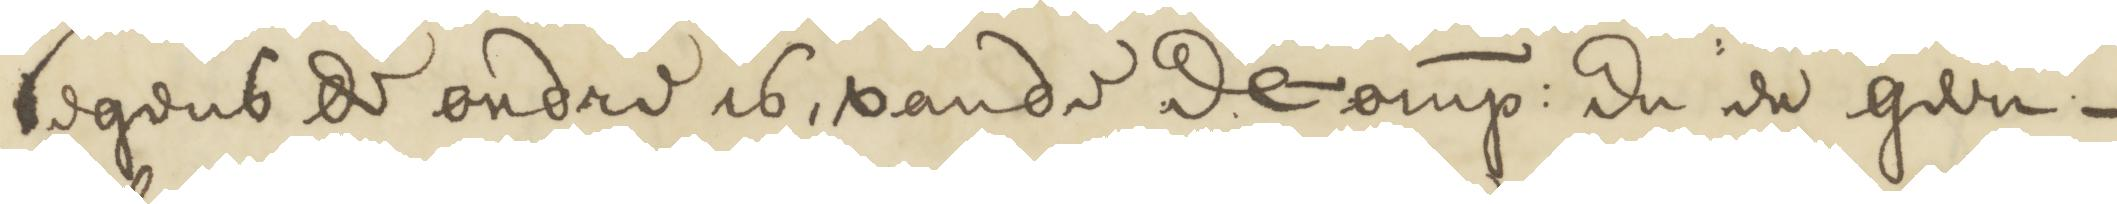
tegens de ordre is, vande E. Comp: En er geen —
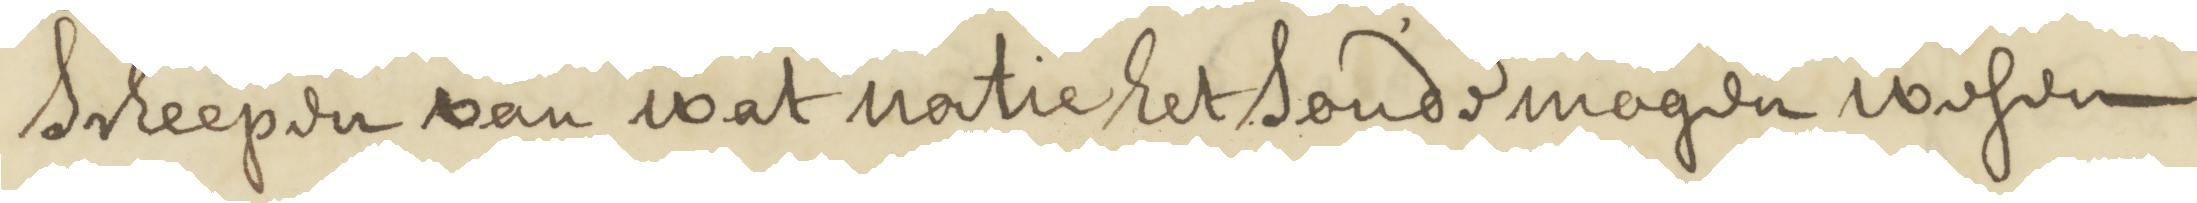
scheepen van wat natie het soude mogen wesen
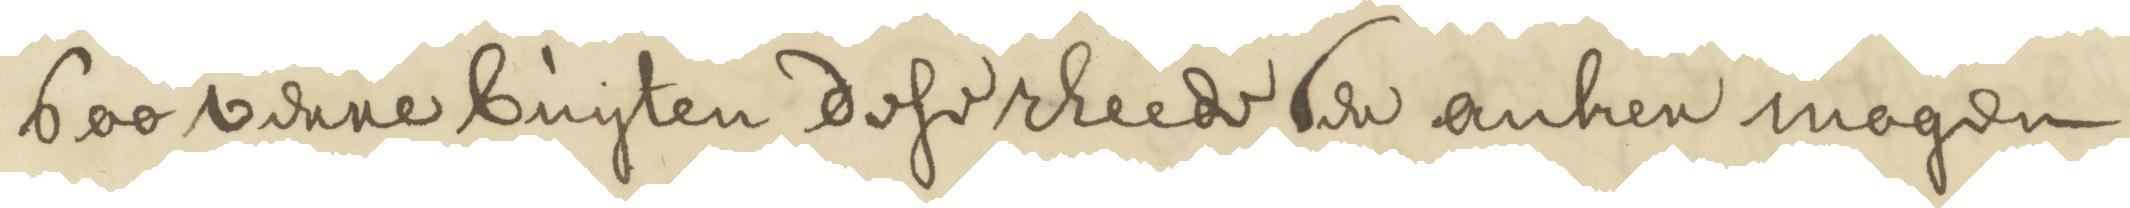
soo verre buijten dese rheede ter anker mogen
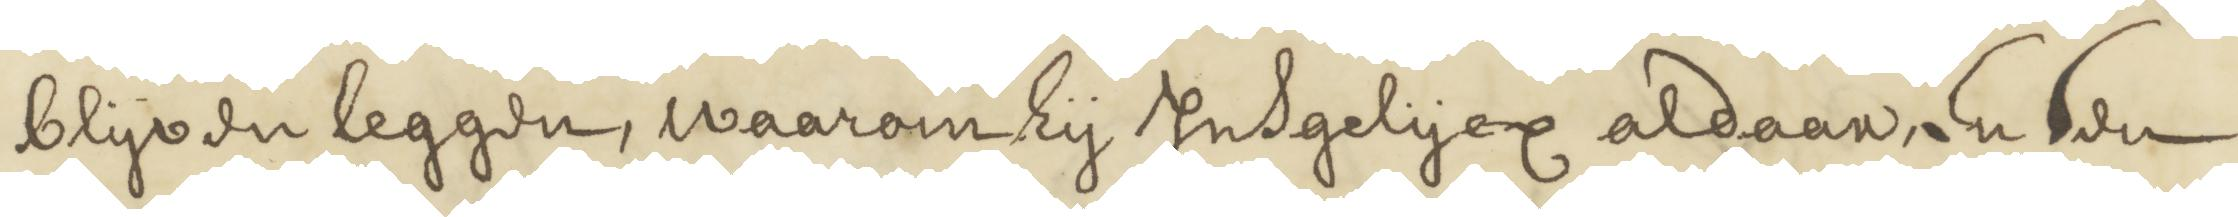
blijven leggen, waarom hij Jnsgelijcx aldaar, en ten
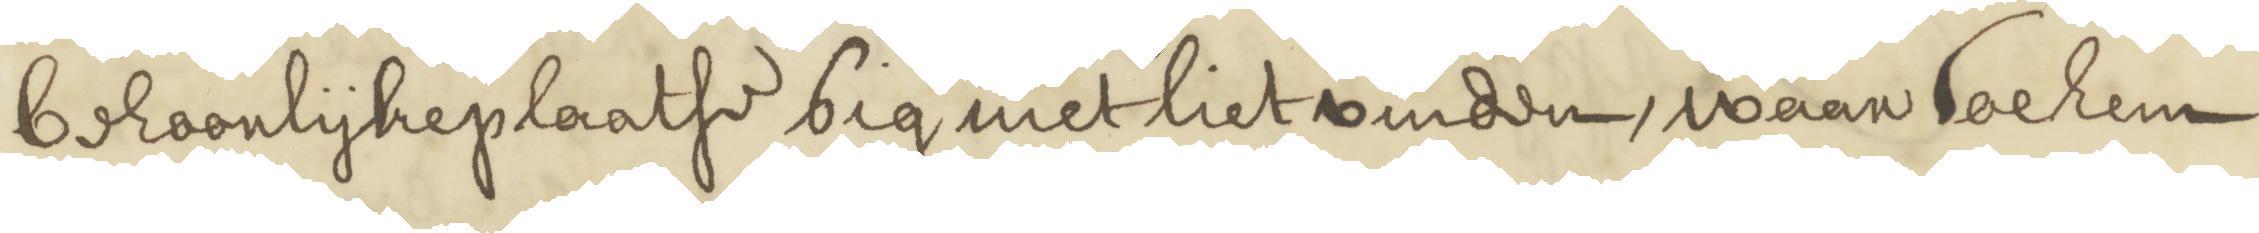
behoorlijke plaatse sig niet liet vinden, waar toe hem
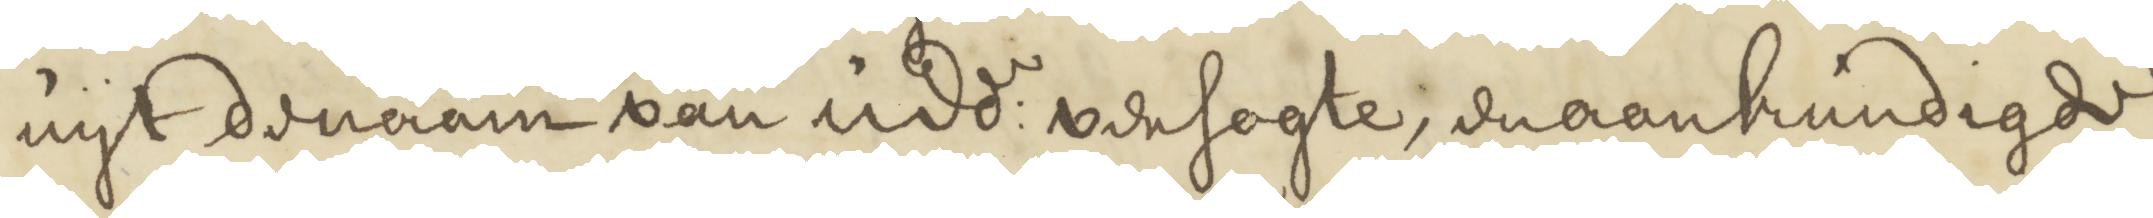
uijt de naam van uEd:e versogte, en aankundigde
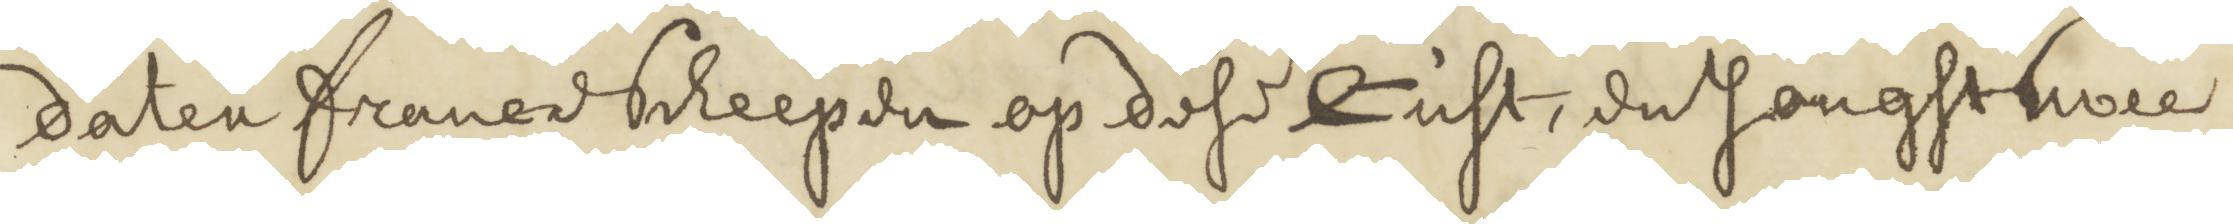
dater france scheepen op dese Cust, en Jongst twee
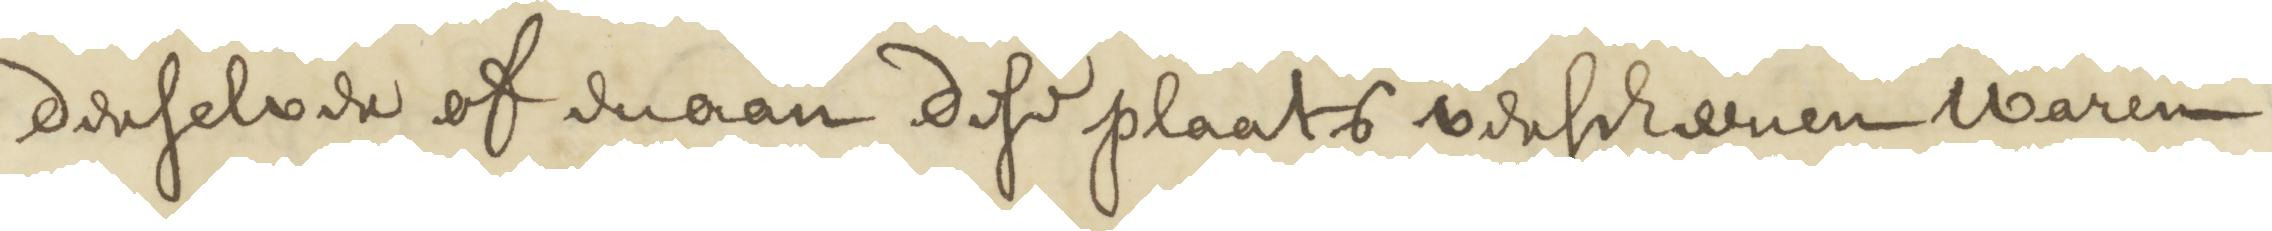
derselver of en aan dese plaats verscheenen waren
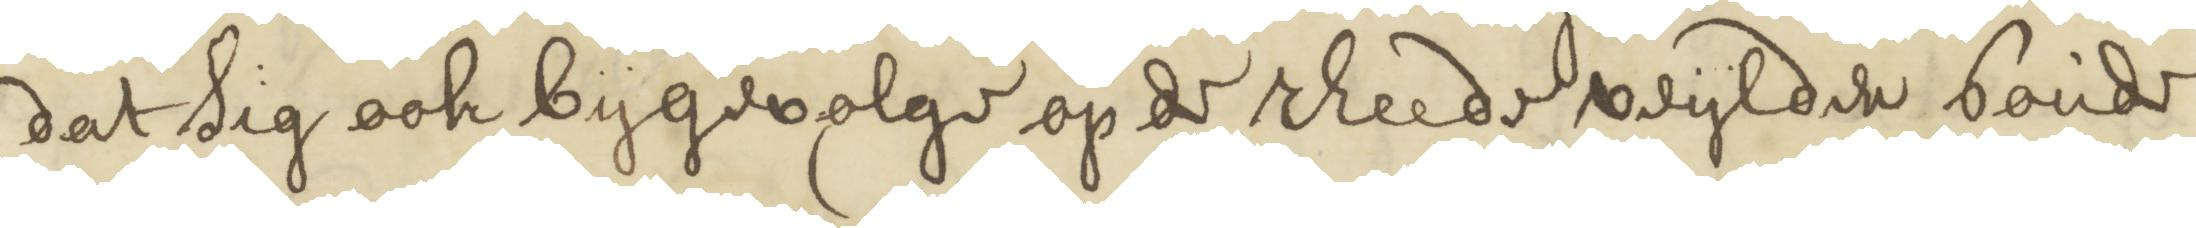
dat sig ook bij gevolge op de rheede veijlder soude
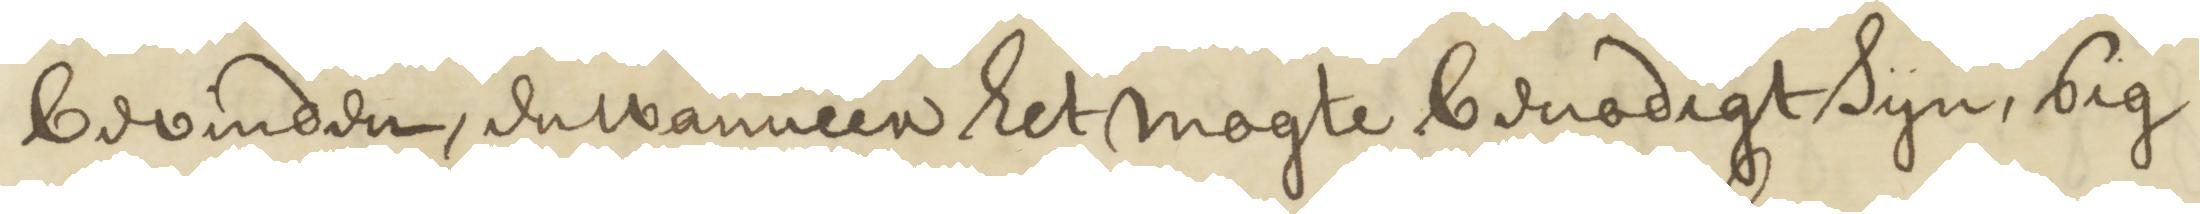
bevinden, en wanneer het mogte benodigt Sijn, sig
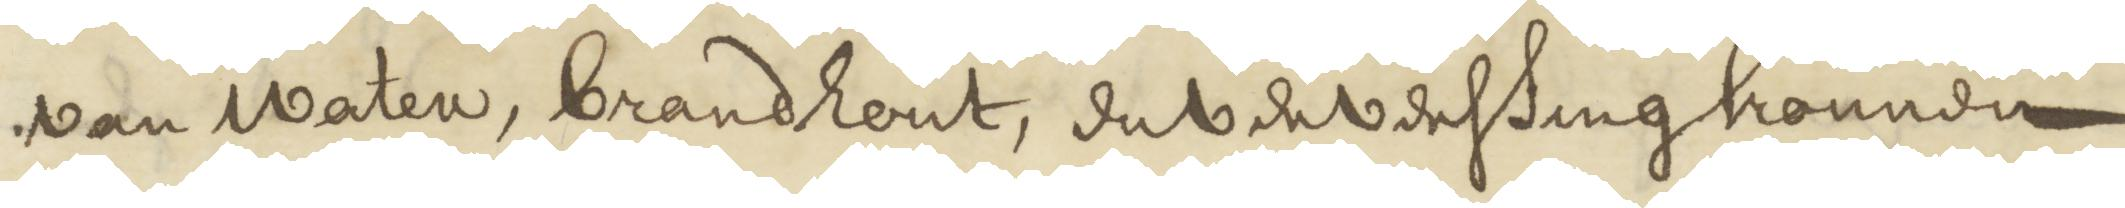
van water, brandhout, en ververssing konnen
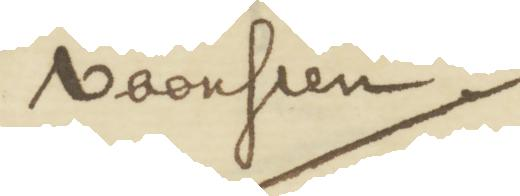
voorsien.
